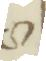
,, 8
